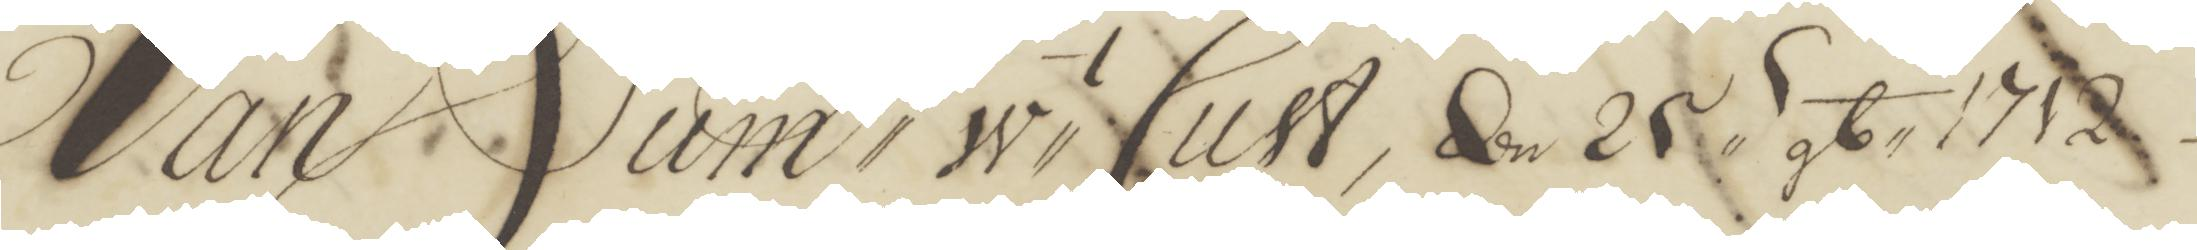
Van Sum„s w„t Cust, den 25,,' 9b„ 1712.
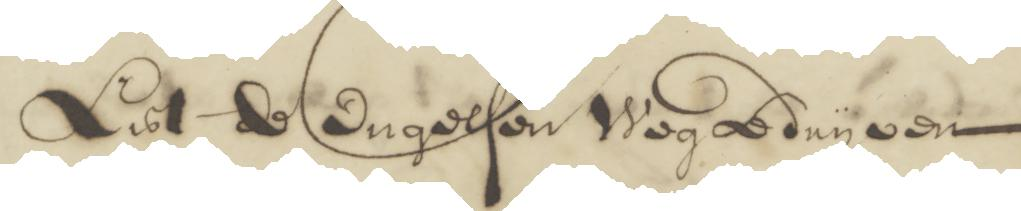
List de Engelsen Weg te drijven.
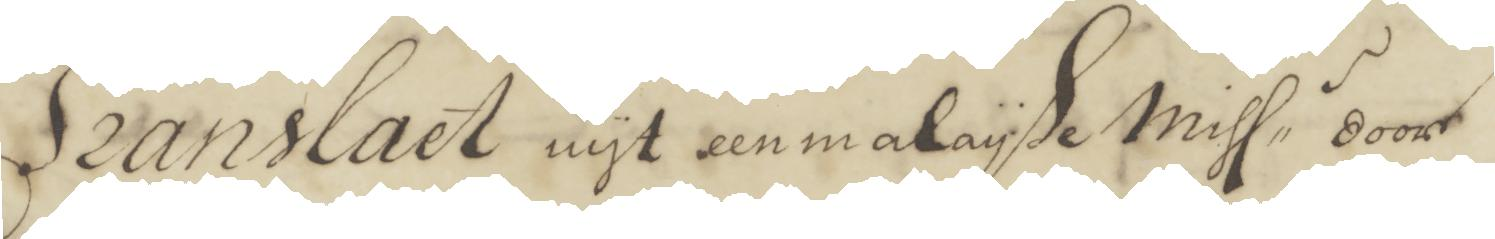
Translaet uijt een malaijSe miss„e door
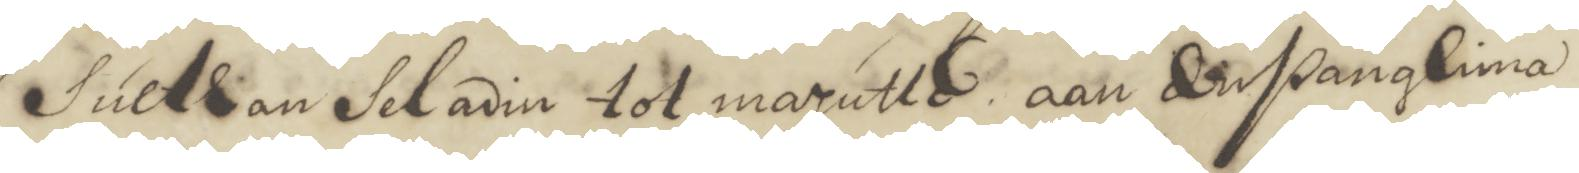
sulthan Seladin tot majutte. aan den panglima
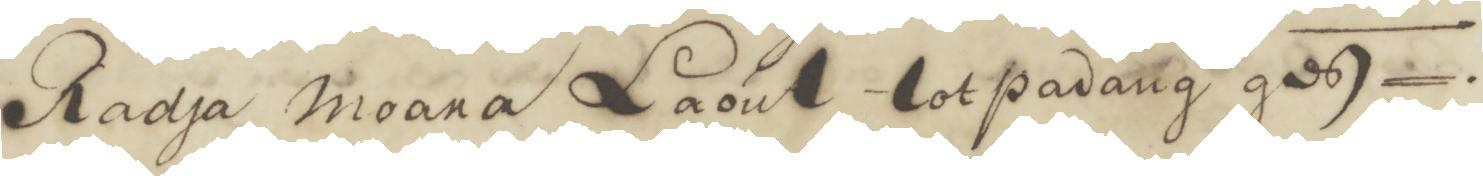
Radja moara Laout tot padang ges =.
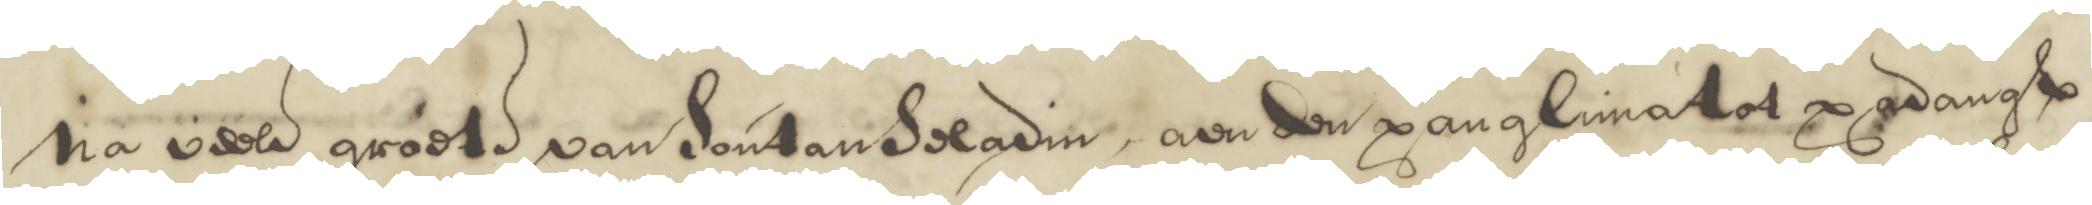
na veele groete van SoutanSeladin , aen den panglima tot padangh
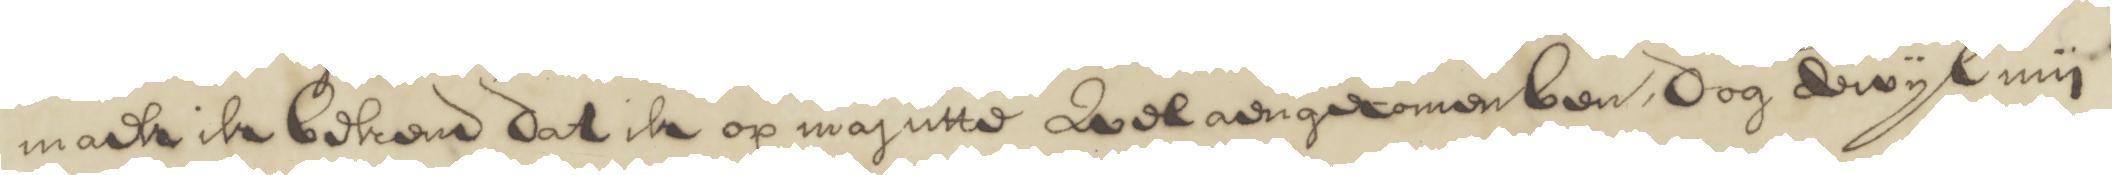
maek ik bekend dat ik op majutte wel aen gecomen ben, dog de wijl mij
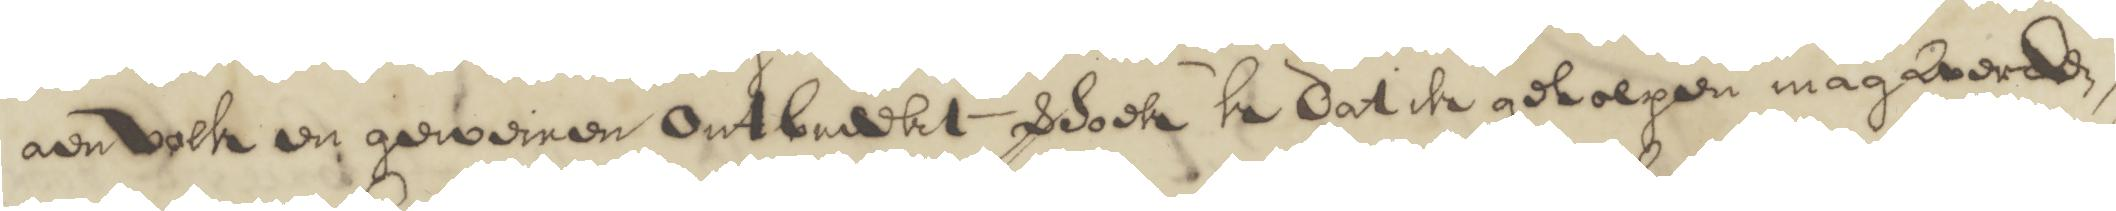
aen volk en geweiren ontbreekt – versoek 'k dat ik geholpen mag werden,
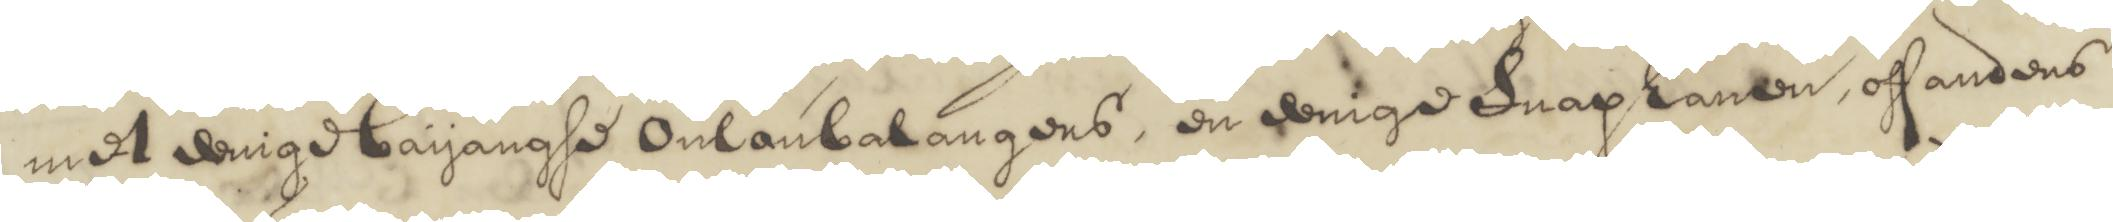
met eenige baijangse ouloubalangers , en eenige snaphanen, off anders
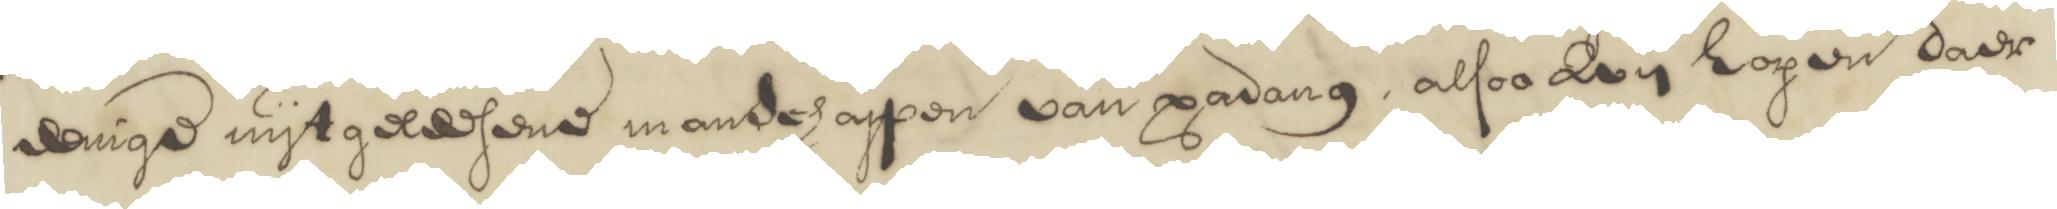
eenige uijt geleesene manschappen van padang , alsoo wij hopen daer
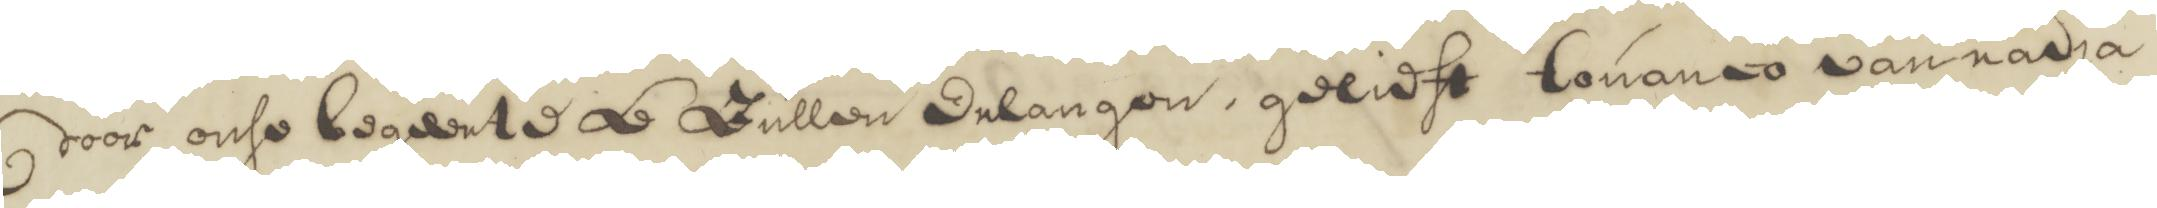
door onse begeerte te zullen Erlangen, gelieft touanco van radja
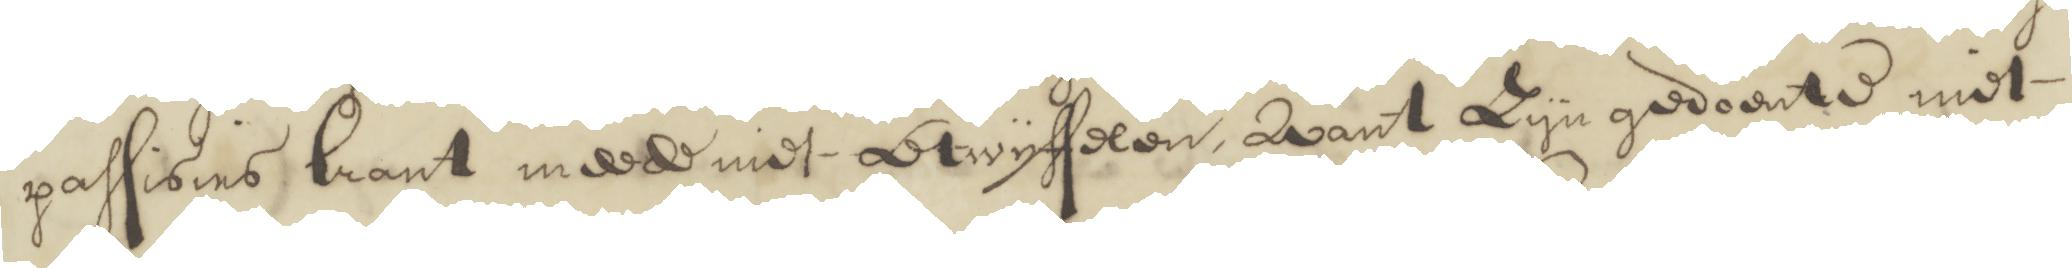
passisirs kant meede niet te twijffelen, want zijn gedoente niet
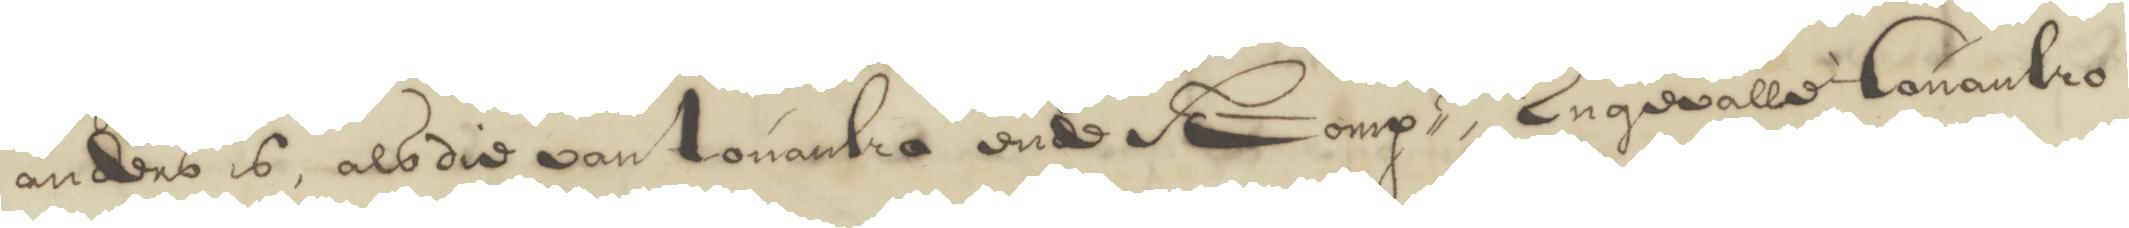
anders is , als die van touanko ende SComp„ , Ingevalle touanko
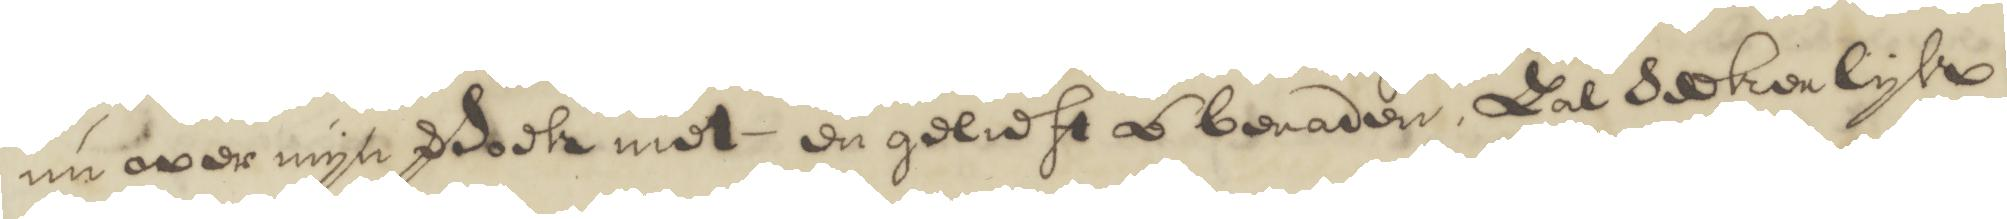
nu over mijn versoek niet – en gelieft te beraden , Zal seekerlijk
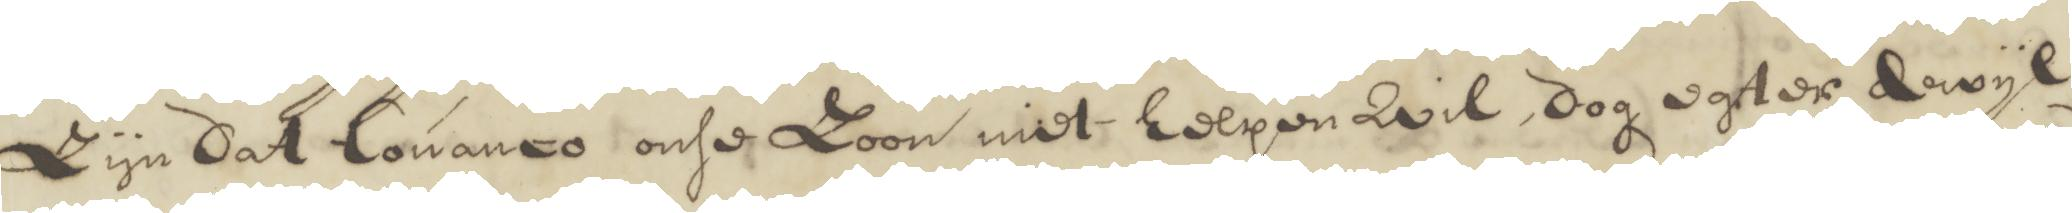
Zijn dat touanco onse Zoon niet helpen wil , dog egter dewijl
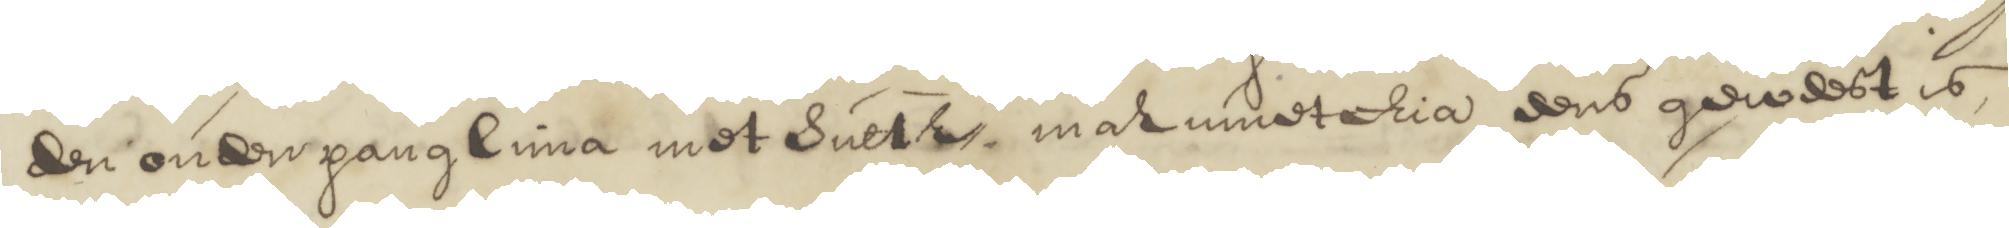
den ouden panglima met sulthan mahumetchia eens geweest is,
